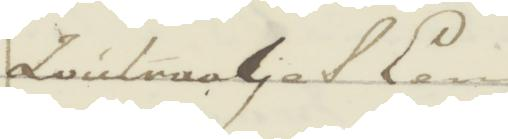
Zoutvaatjes Een
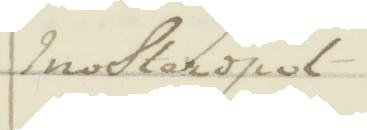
mosterdpot
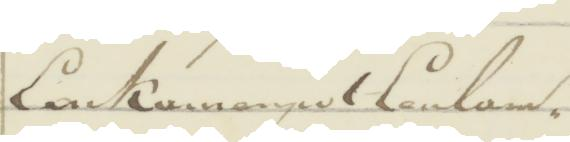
Een Kamerpot Eenlam„
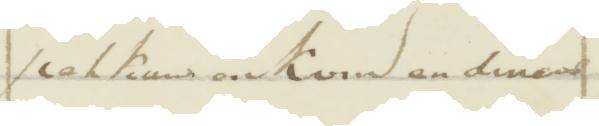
pet kan en Kom en divers
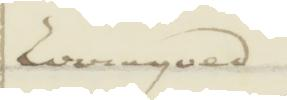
roomgoed
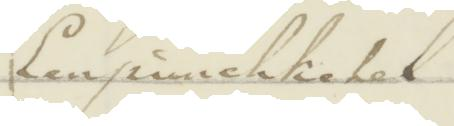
Een punchketel
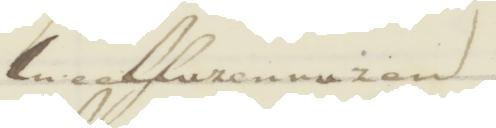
twee Glazen vazen
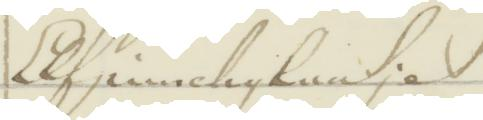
Elf punchglaasjes
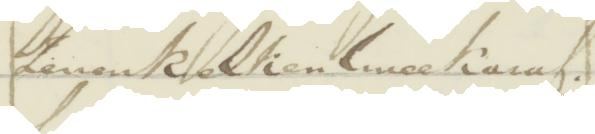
Zevenkelken twee karaf.
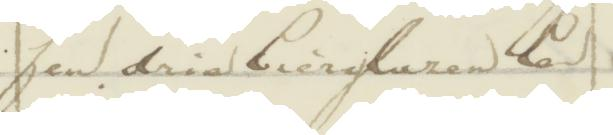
fen drie bierglazen Een
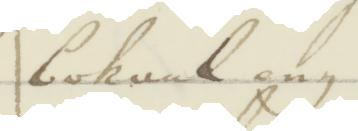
bokaal enz
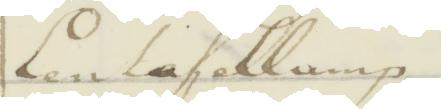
Een tafellamp
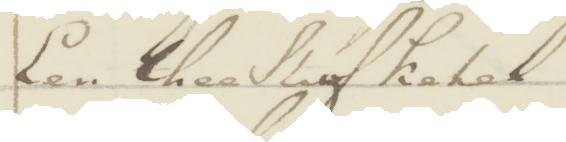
Een theestoof ketel
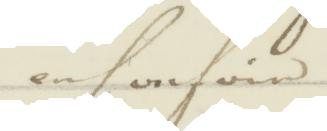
en Confoir
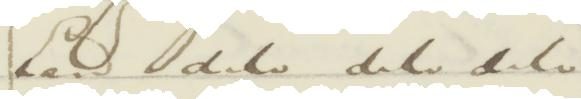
Een dito dito dito
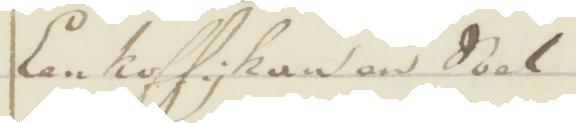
Een koffijkan en Voet
